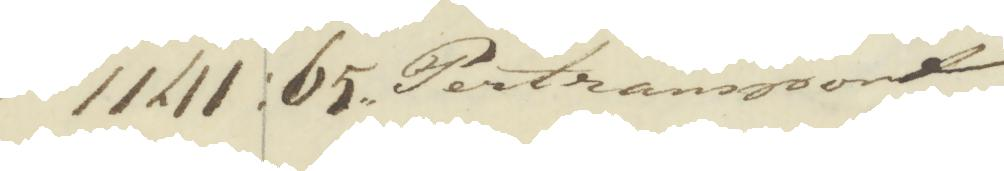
ƒ1141 :65 Per transport
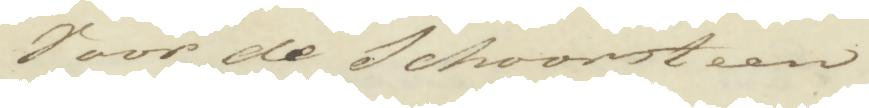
Voor de Schoorsteen
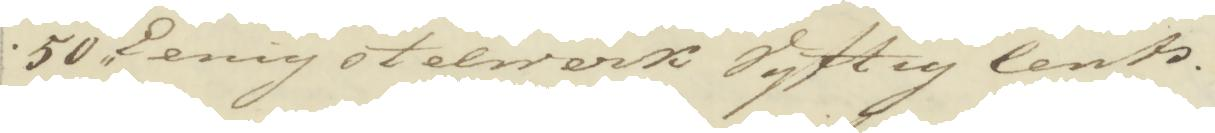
—:50 „ Eenig otelwerk Vyftig Cents.
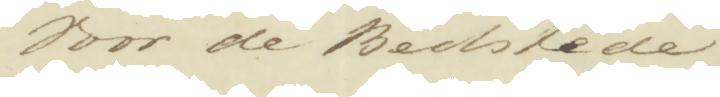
voor de Bedstede
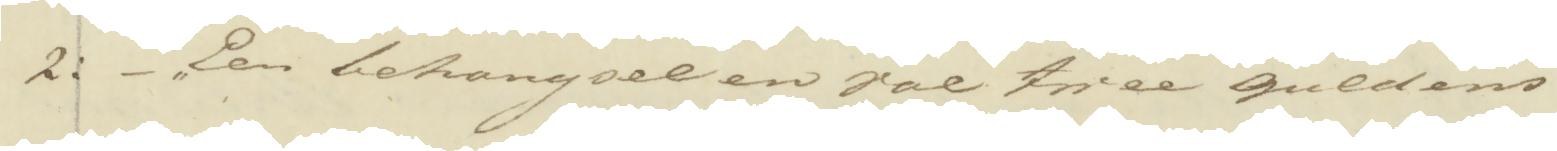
2: — „ Een behangsel en val twee guldens
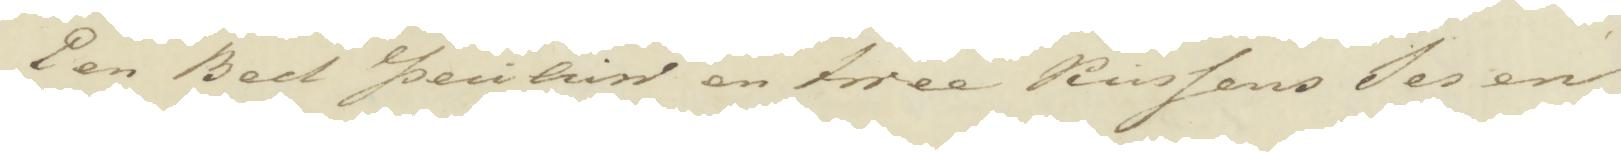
Een Bed Peuluw en twee Kussens Ses en
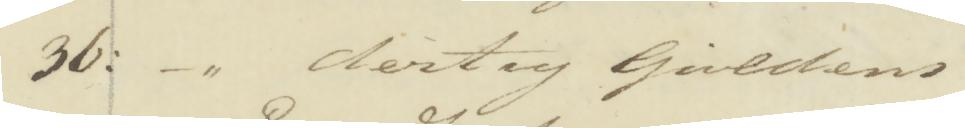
36: —„ dertig Guldens
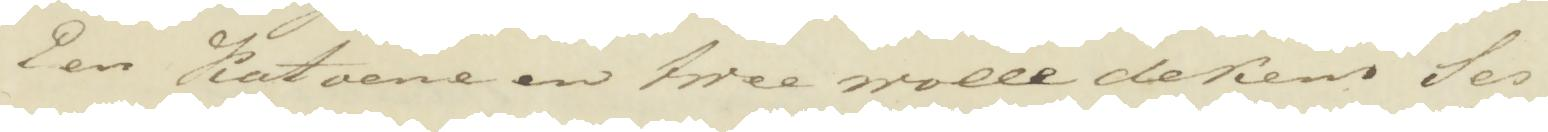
Een Katoene en twee wolle dekens Ses
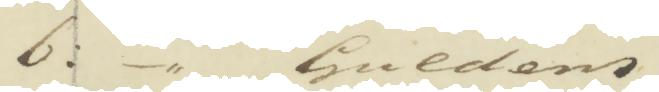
6: —„ Guldens
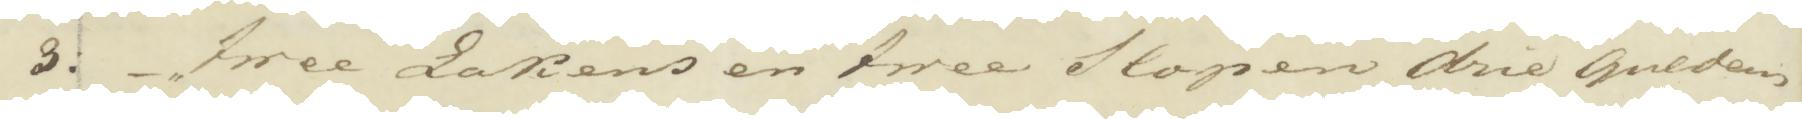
3: —„ twee Lakens en twee Slopen drie guldens
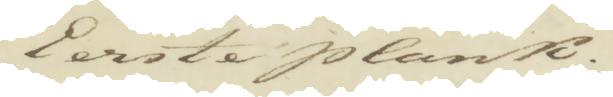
Eerste plank.
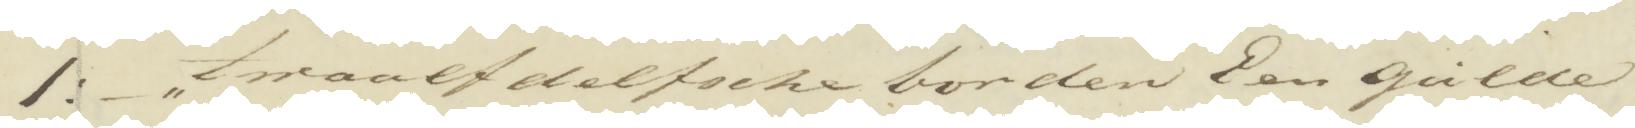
1: — „twaalf delftsche borden Een gulde
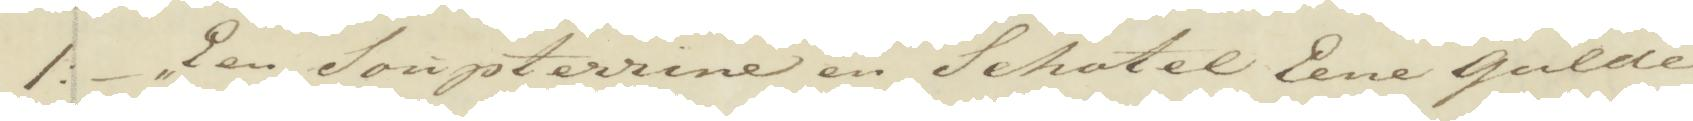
1: — „Een Soupterrine en Schotel Eene gulde
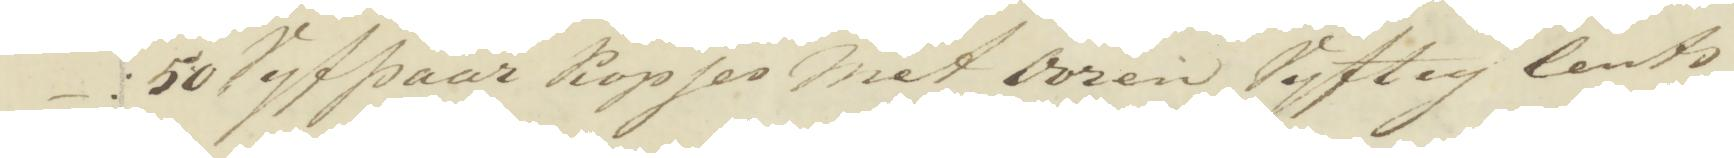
—: 50 Vyf paar Kopjes met Ooren Vyftig Cents
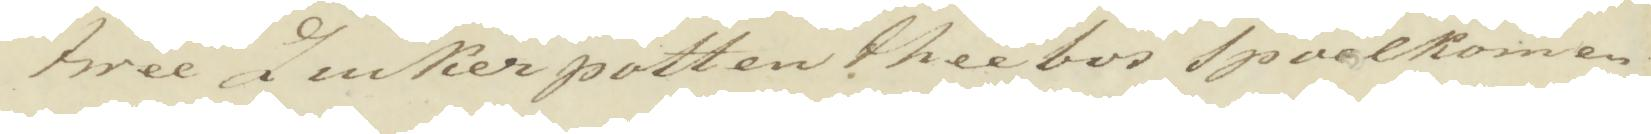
twee Zuikerpotten theebos spoelkom en
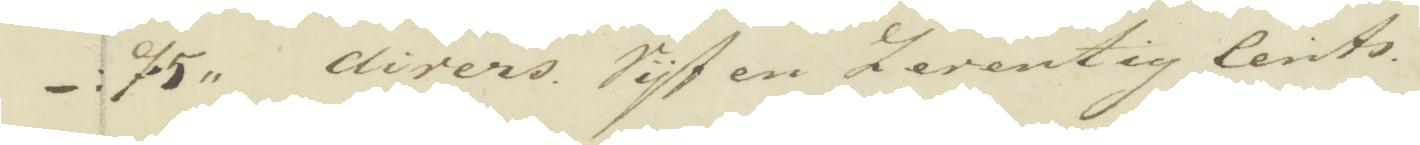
—: 75„ divers Vijf en Zeventig Cents.
